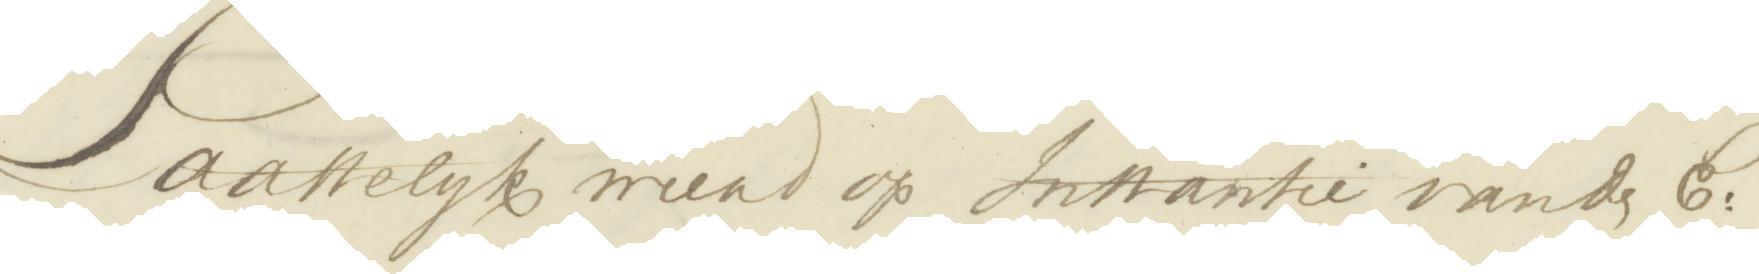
Laastelijk wierd op Jnstantie van de E:
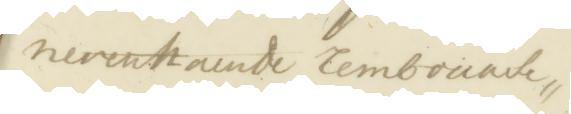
nevenstaende rembourse„
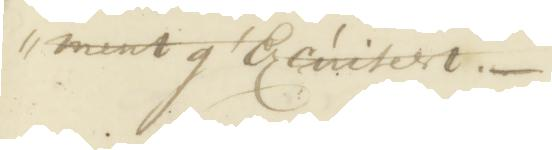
„ment g’Excuiteert.
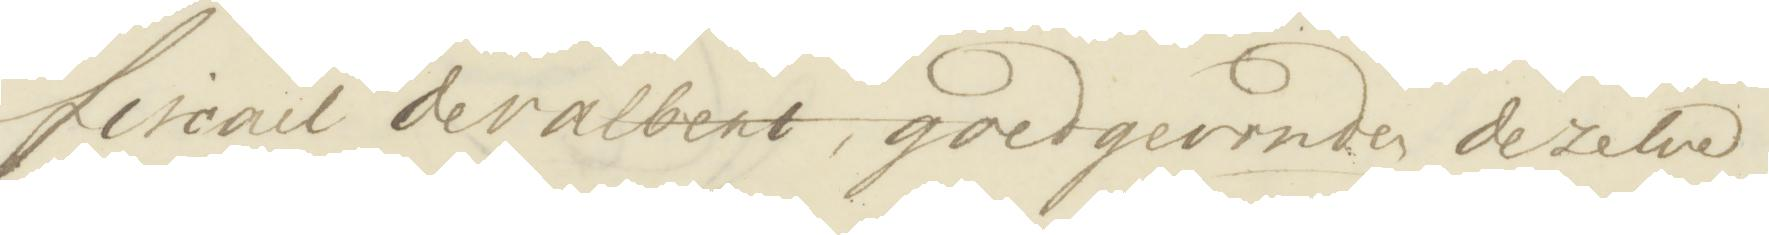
fiscael de valbert, goedgevonden dezelve
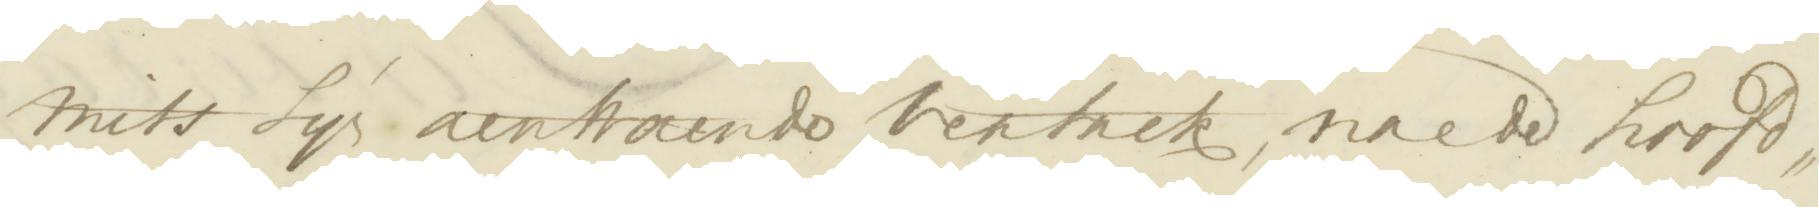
mits sijn aenstaende vertrek, noede hoofd„
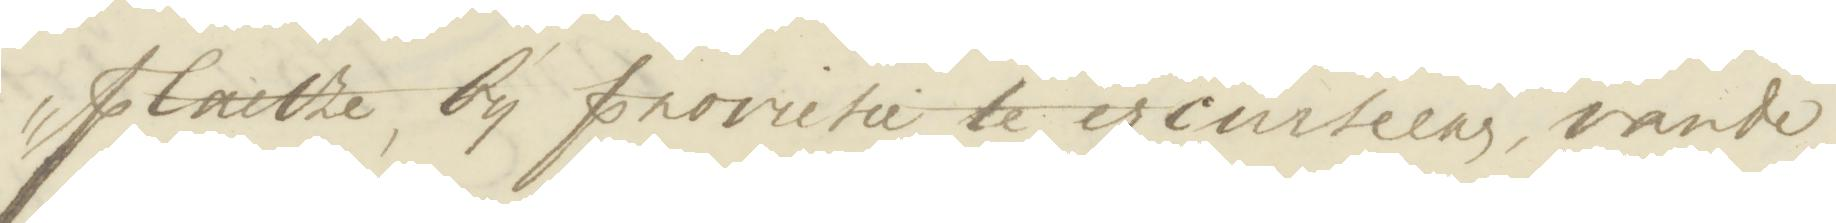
„plaetze, bij proviesie te excuiteeren, van de
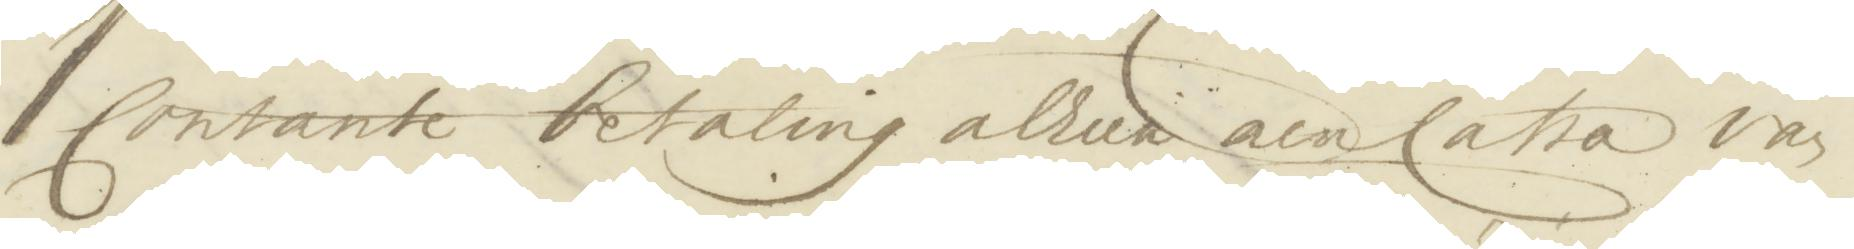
Contante betaling alhier aen Cassa van
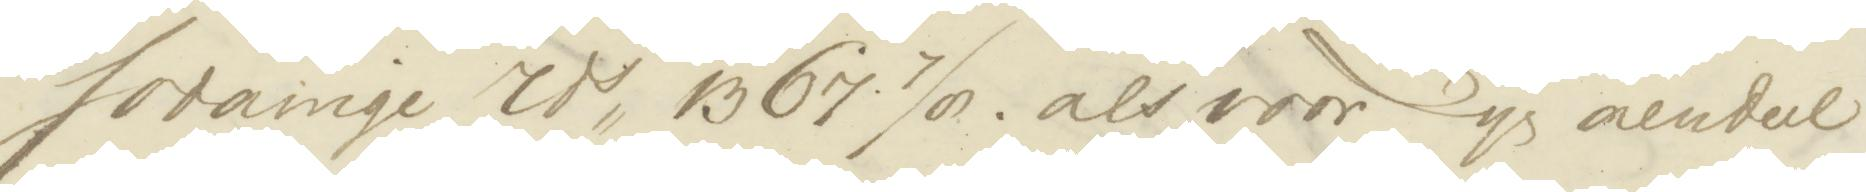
sodanige rd„s 1367 7/8. als voor zijn aendeel
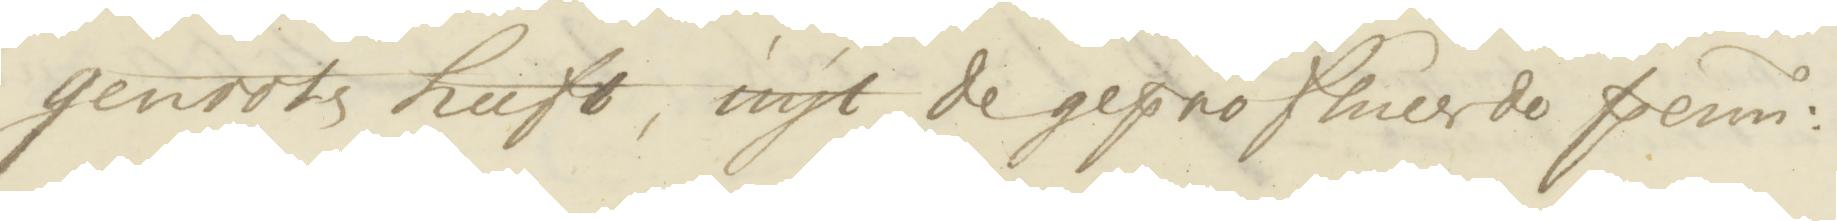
genooten heeft, uijt de geproflueerde penn:
